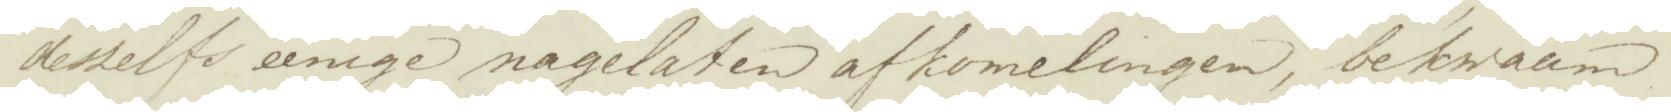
deszelfs eenige nagelaten afkomelingen, bekwaam
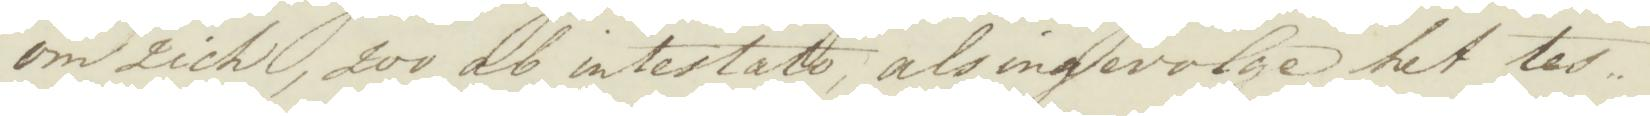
om zich, zoo ab intestato; als ingevolge het tes„
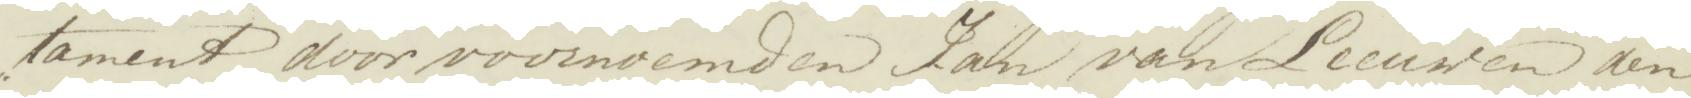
tament door voornoemden Ian van Leeuwen den
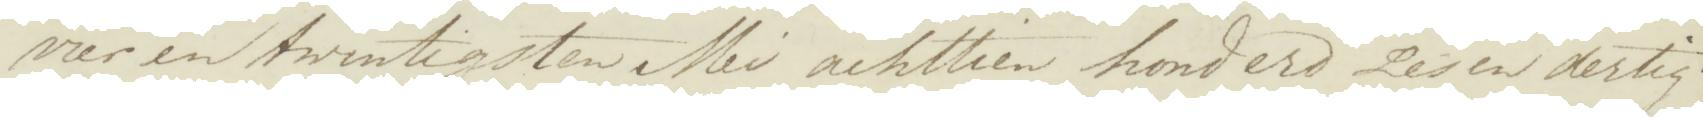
vier en twintigsten Mei achttien honderd zes en dertig
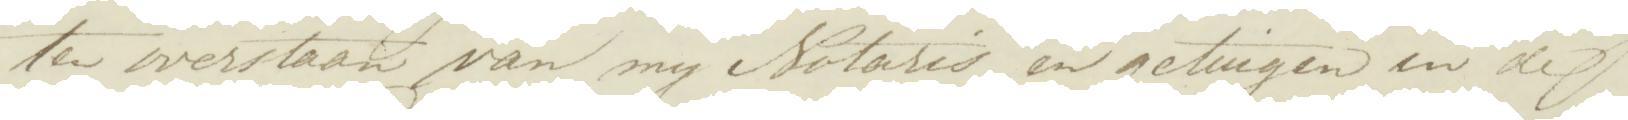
ten overstaan van my Notaris en getuigen in de
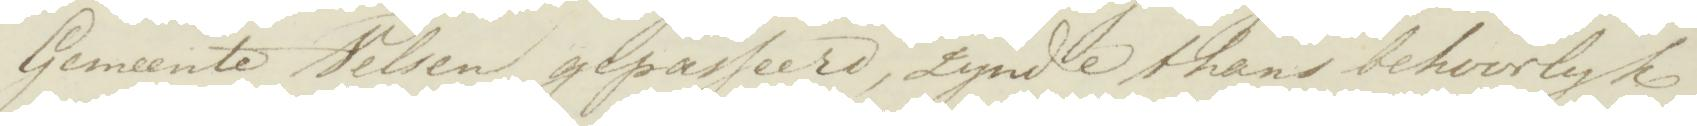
Gemeente Velsen gepasseerd, zynde thans behoorlyk
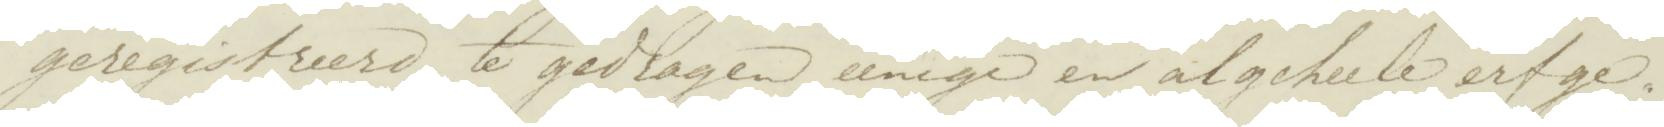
geregistreerd, te gedragen eenige en algeheele erfge„
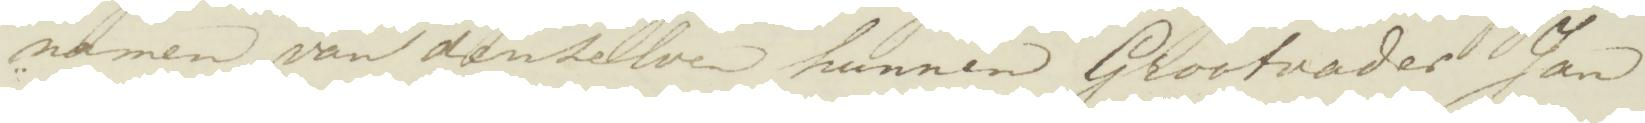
„namen van denzelven hunnen Grootvader Jan
